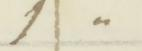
1 ..
